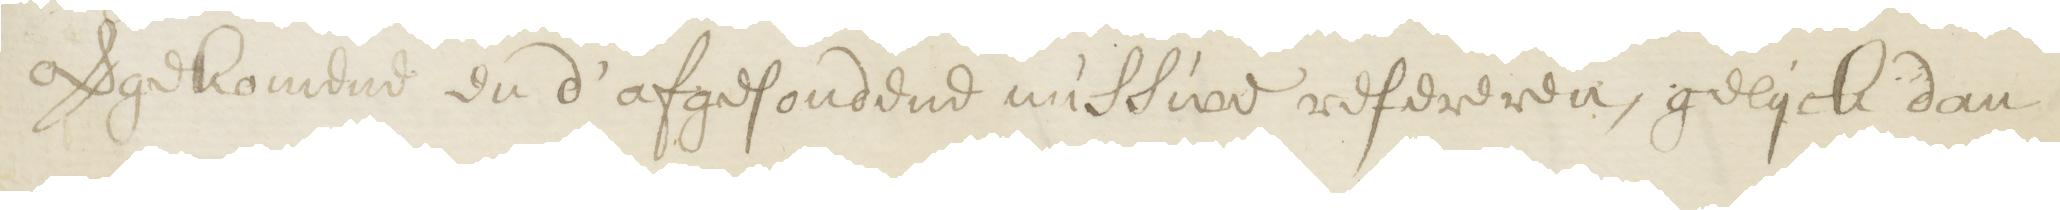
overgekomene en d’ afgesondene missive refereren, gelijck dan
